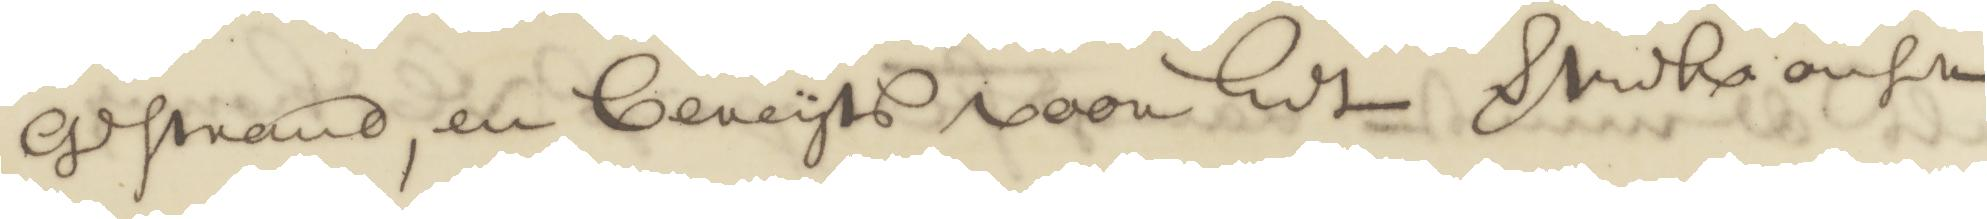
gestrand, en bereijts voor het vertrek onsen
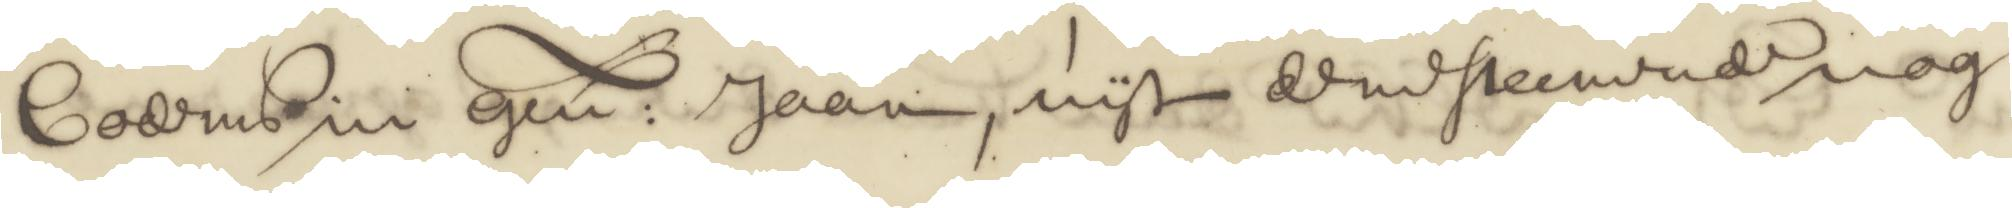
bodems in gen: jaar, uijt de resteerende nog
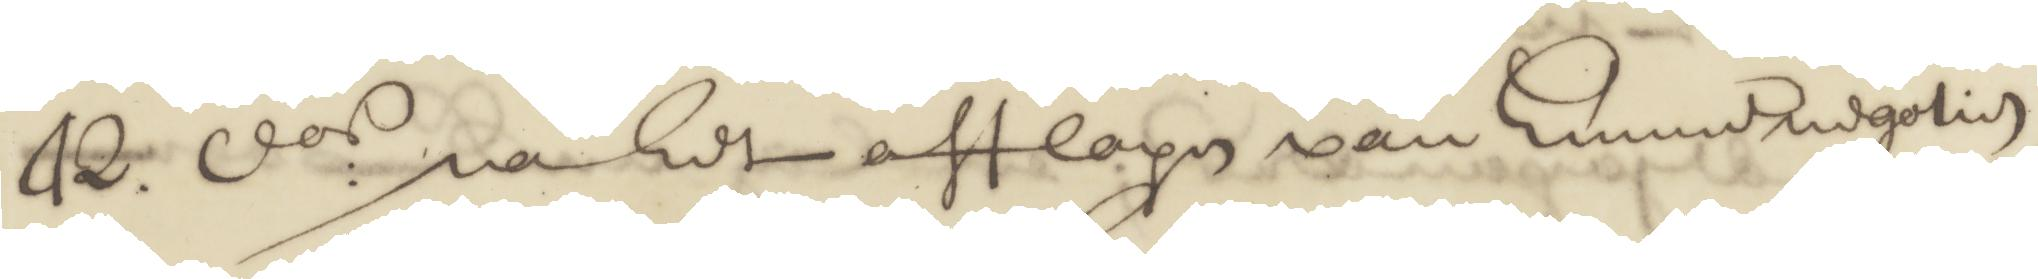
42. d:os na het afflopen van hunne negotien
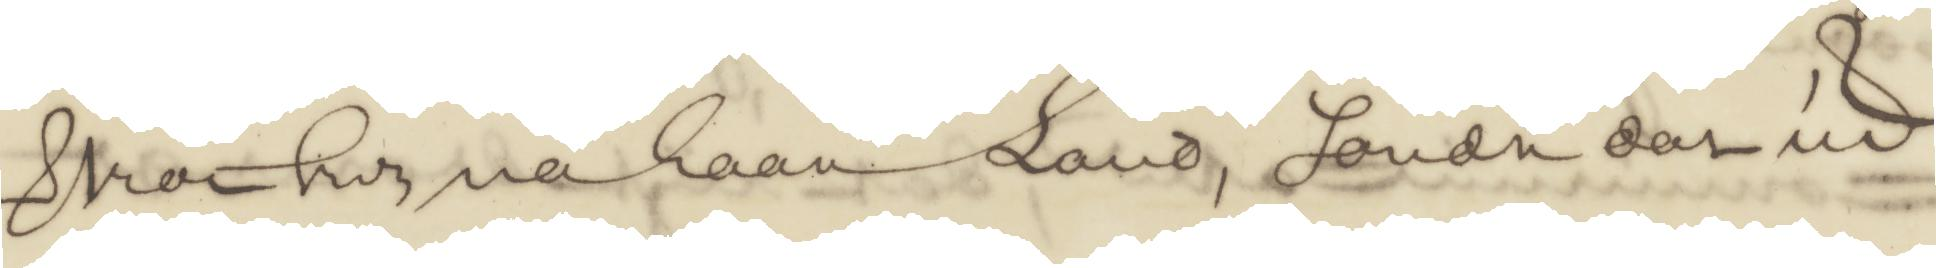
vertrocken na haar land, sondr dat uE
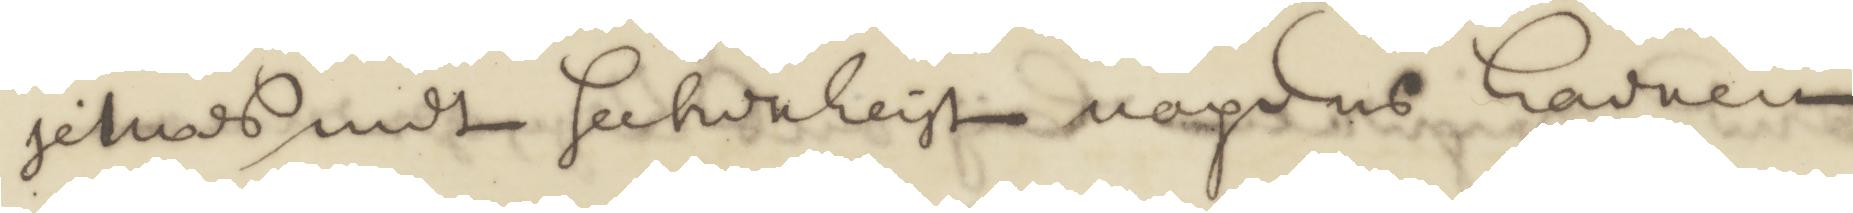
ietwes met seekerheijt nopens haeren
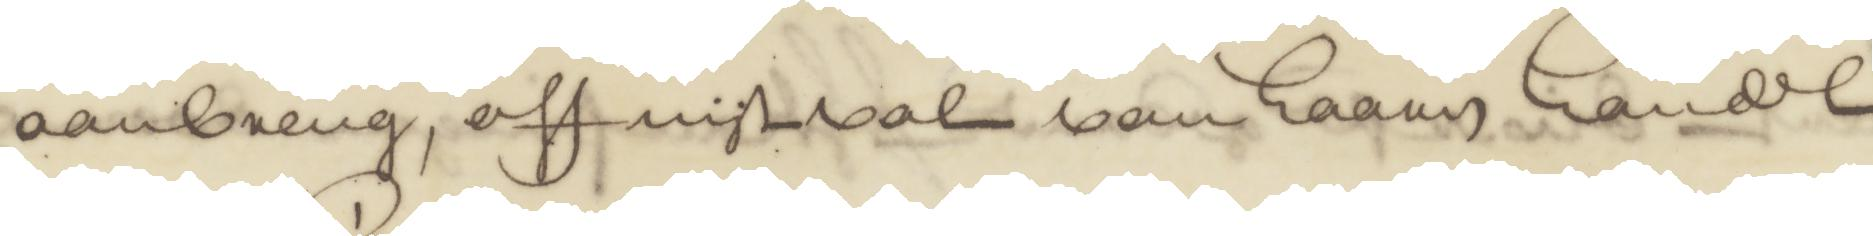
aanbreng, off uijtval van haaren handel
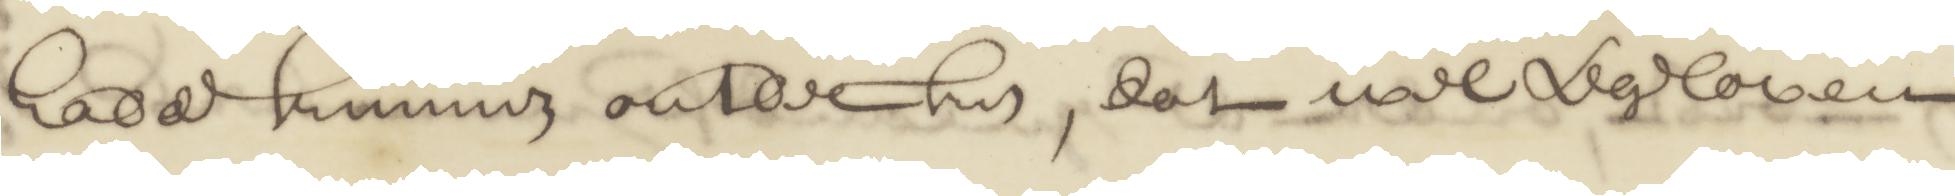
hadde kunnen ontdecken, dat wel tegeloven
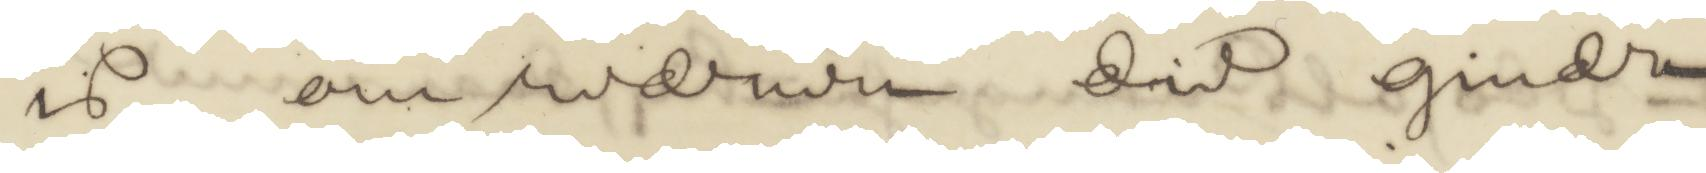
is om redenen die ginder
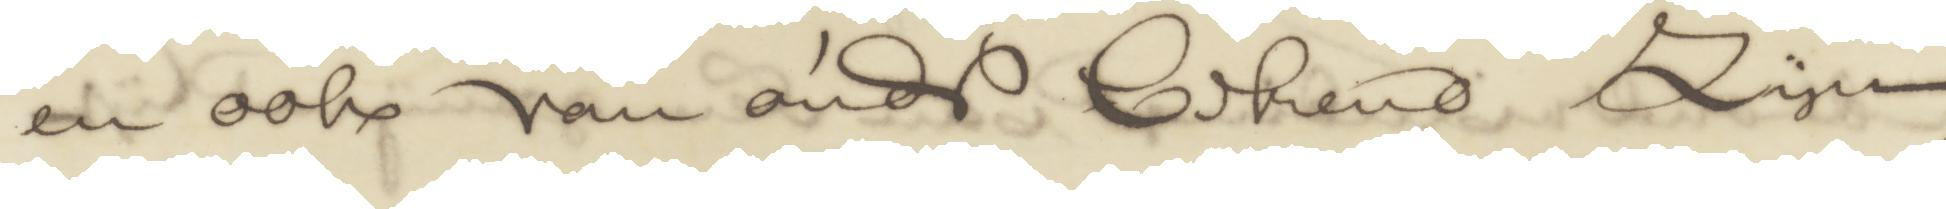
en ook van oude Bekend Zijn
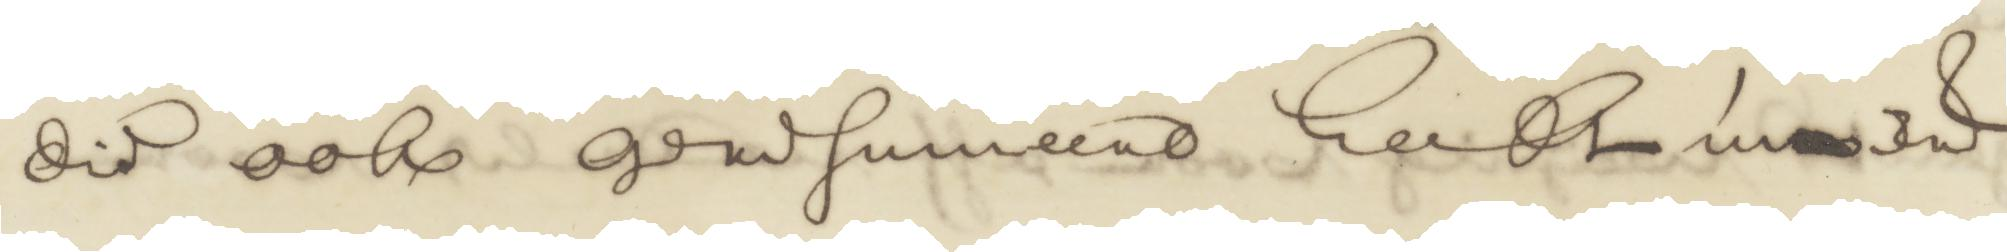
die ook geresumeerd heeft uweE
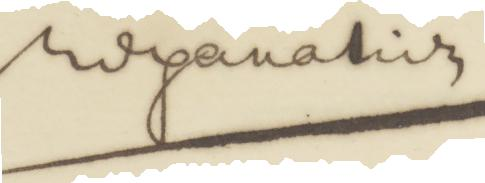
reparatien
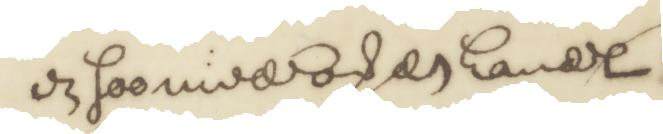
en soo mede over den handel
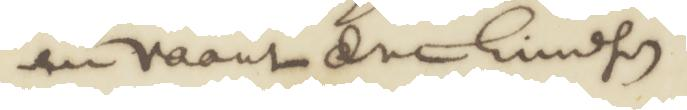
en vaart der chinesen
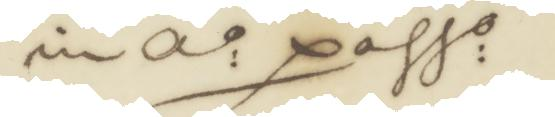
in a:o pass:o
